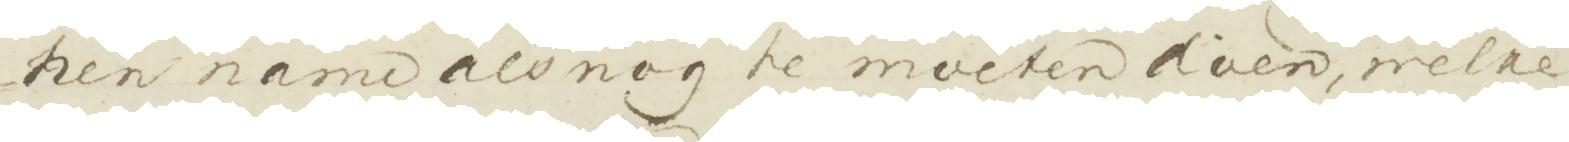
„nen name als nog te moeten doen, welke
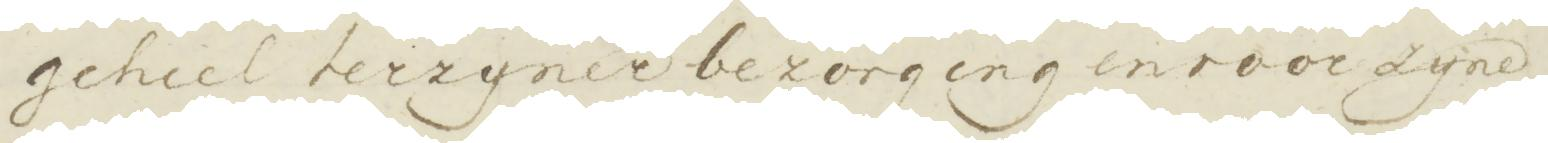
geheel ter zyner bezorging en voor zyne
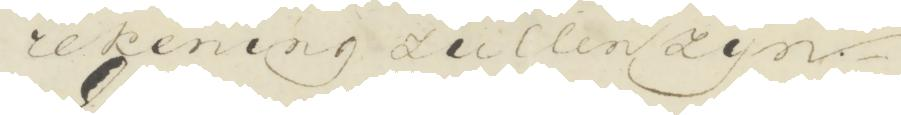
rekening zullen zyn.-
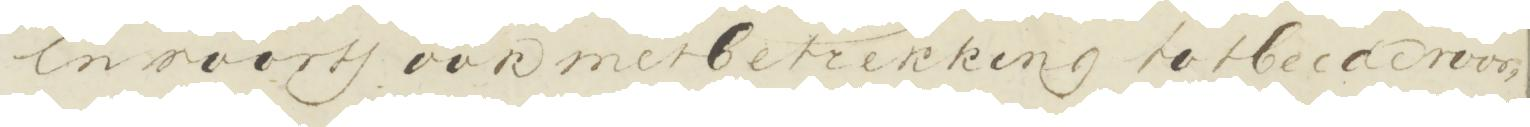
En voorts ook met betrekking tot beide voor„
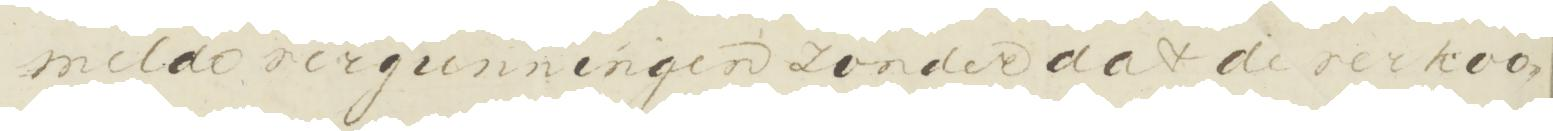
„melde vergunningen zonder dat de verkoo„
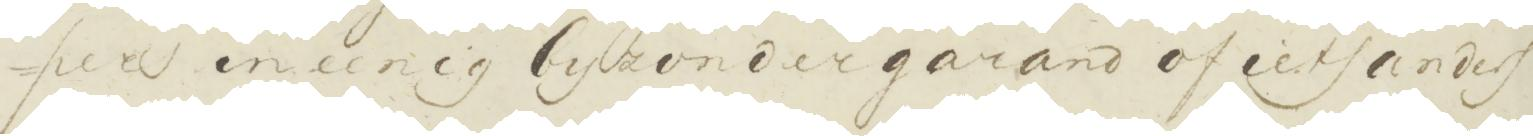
„pers in eenig byzonder garand of iets anders
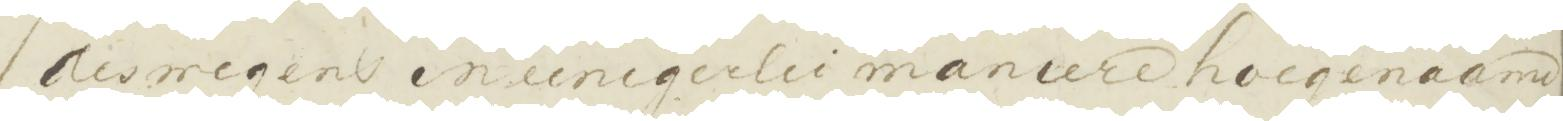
deswegens in eenigerlei maniere hoegenaamd
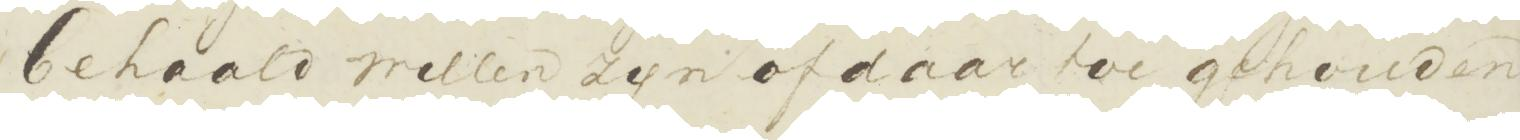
behaald willen zyn of daar toe gehouden
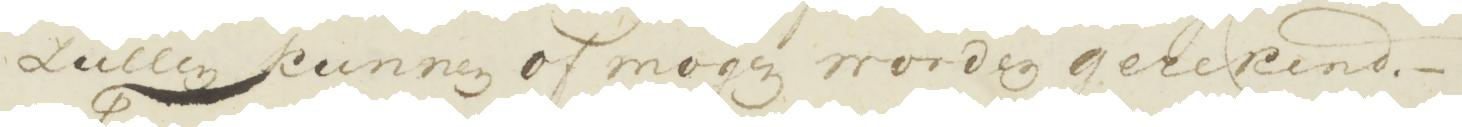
zullen kunnen of mogen worden gerekend.-
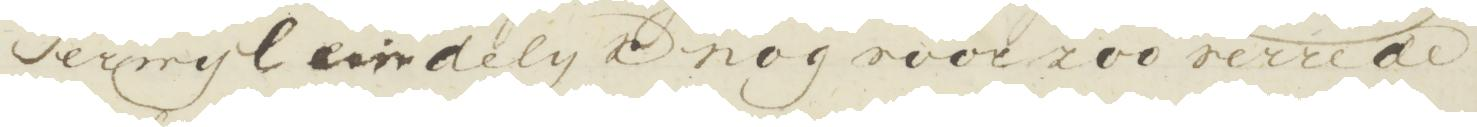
Terwyl eindelyk nog voor zoo verre de
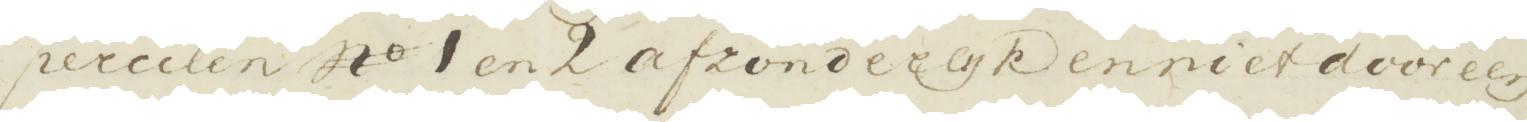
percelen n=o 1 en 2 afzonderlyk en niet door een
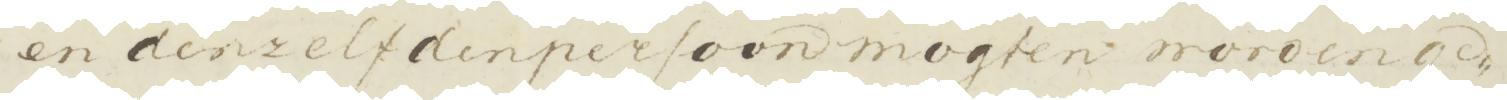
en denzelfden persoon mogten worden ge„
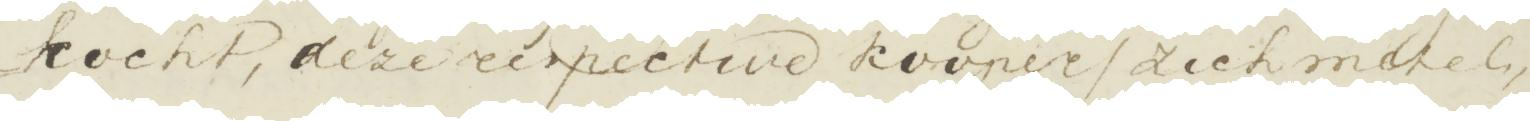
kocht, deze respective koopers zich met el„
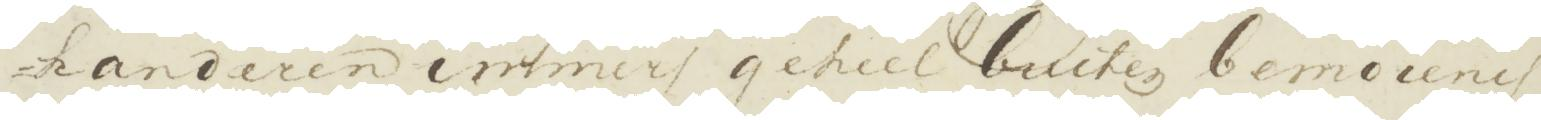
„kanderen inmers geheel buiten bemoienis
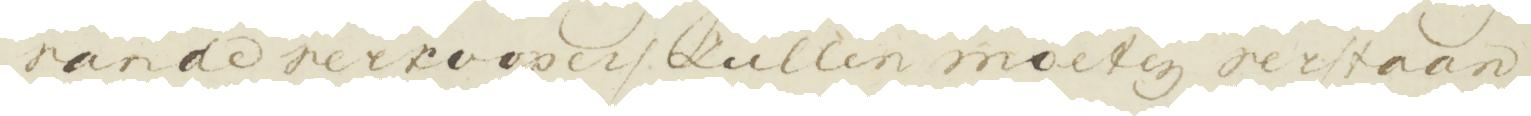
van de verkoopers zullen moeten verstaan
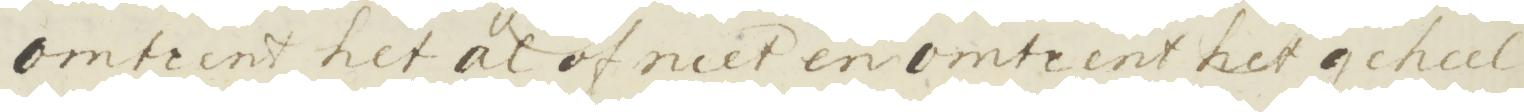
omtrent het al of niet en omtrent het geheel
